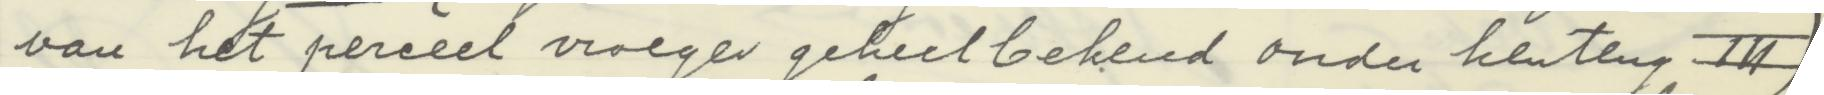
van het perceel vroeger geheel bekend onder kenteng III)
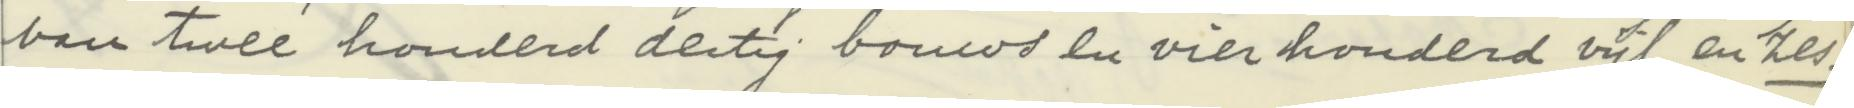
van twee honderd dertig bouws en vier honderd vijf en zes-
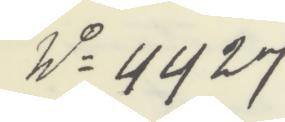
n=o 4427
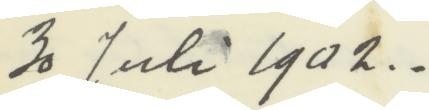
30 Juli 1902. -
